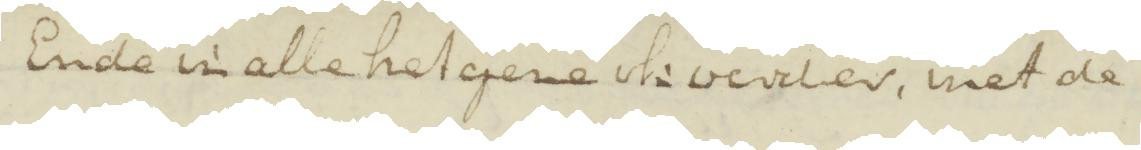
Ende in alle hetgene ik verder, met de
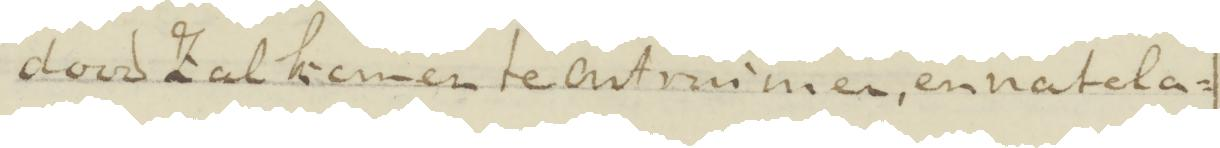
dood zal komen te ontruimen, en natela=
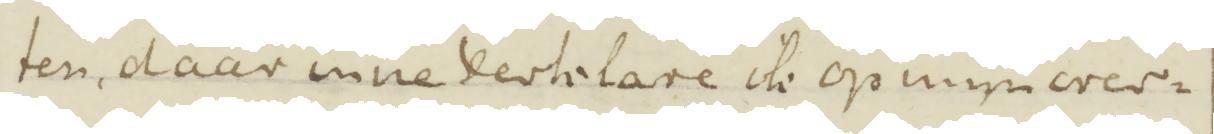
ten, daar inne verklare ik op myn over=
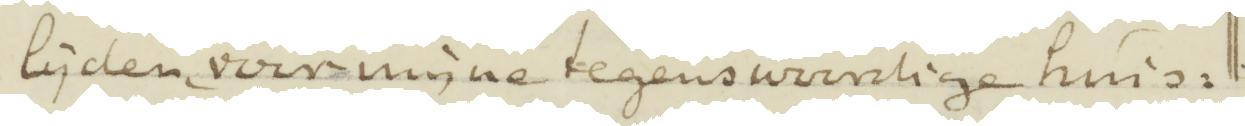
lijden voor mijne tegenswoordige huis=
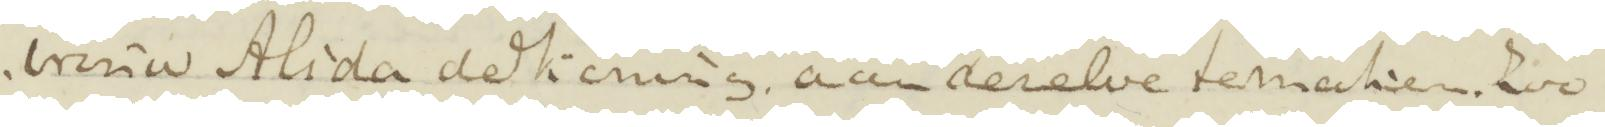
vrouw Alida de Koning, aan dezelve temaken, zoo
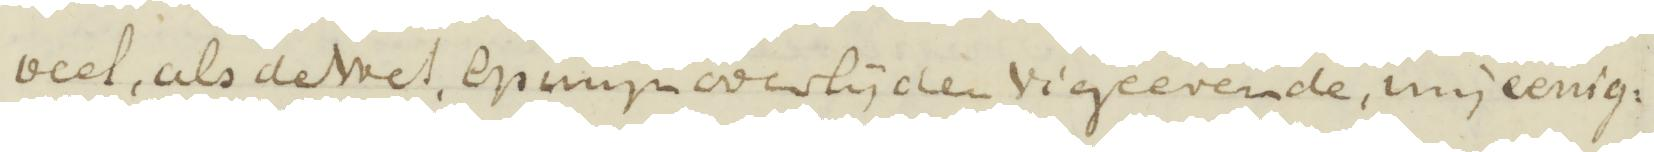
veel, als de wet, op myn overlijden vigeerende, mij eenig=
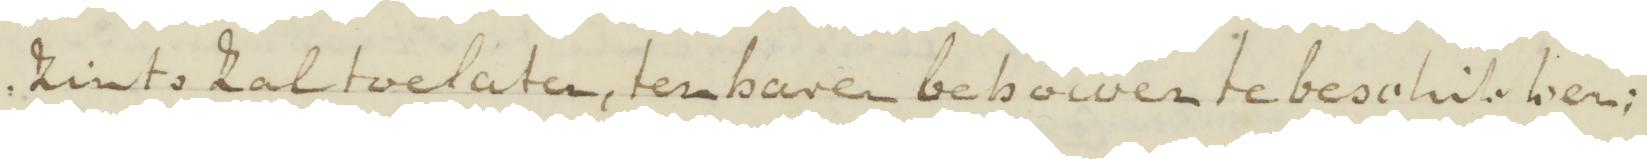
=zints zal toelaten, ten haren behoeven te beschikken;
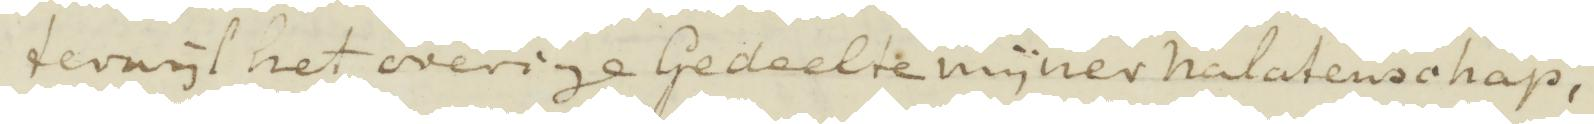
terwijl het overige Gedeelte mijner Nalatenschap,
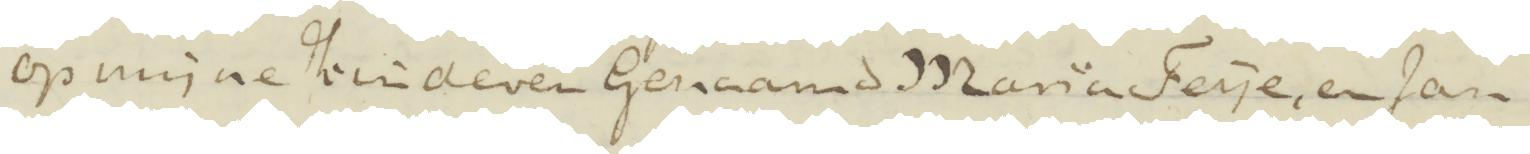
op mijne Kinderen Genaamd Maria Feije, en Jan
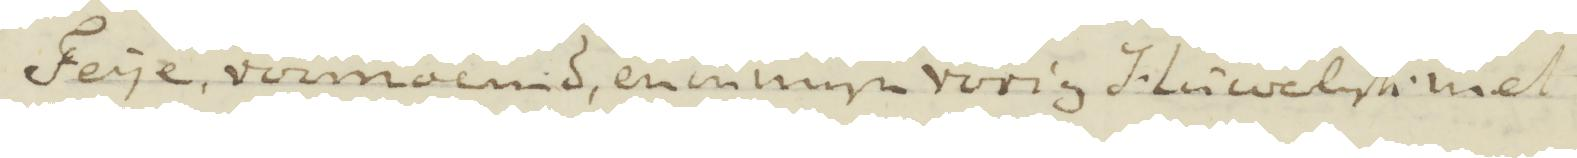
Feije, voornoemd, en in mijn vorig Huwelyk met
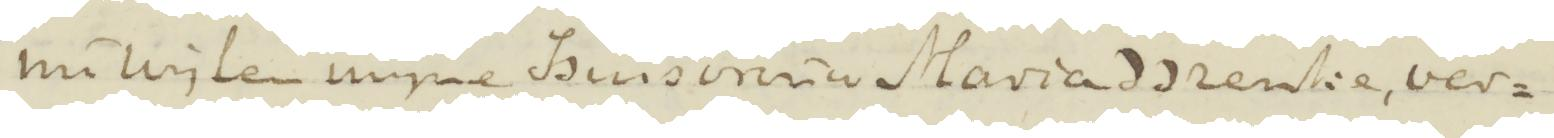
nu wijlen myne Huisvouw Maria Menke, ver=
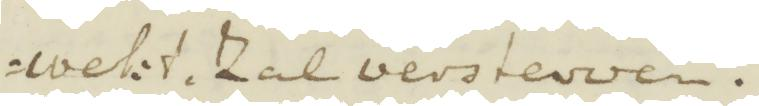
=wekt, zal versterven.
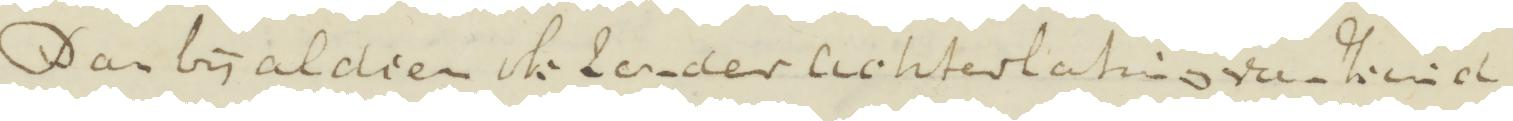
Dan bij aldien ik zonder achterlating van Kind
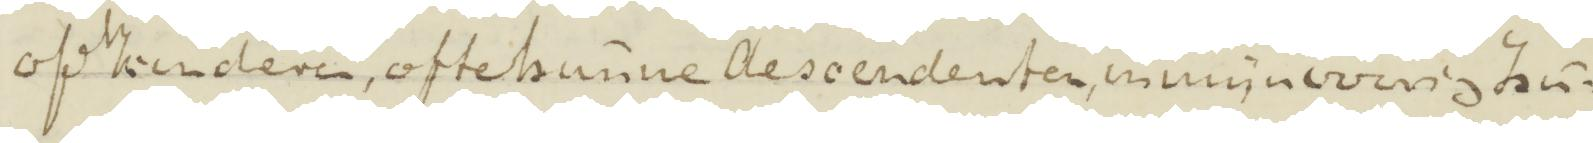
of Kinderen, of te hunne descendenten, in mijn voorig hu=
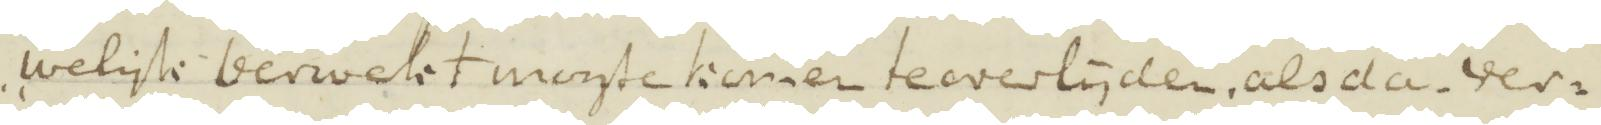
„welijk verwekt mogte komen te overlijden, als dan ver=
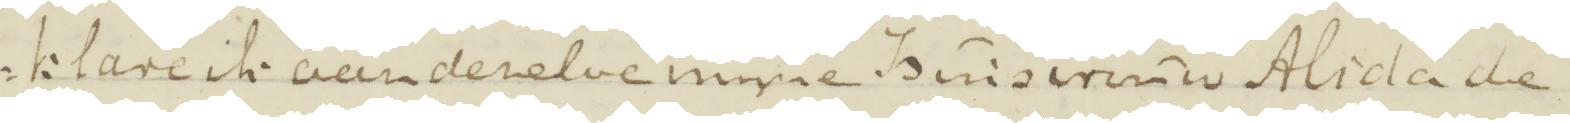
=klare ik aan dezelve myne huisvrouw Alida de
